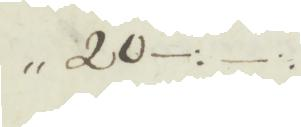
„ 20 —: —:
